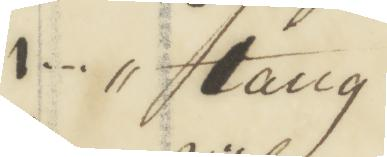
1.-. „ tang
